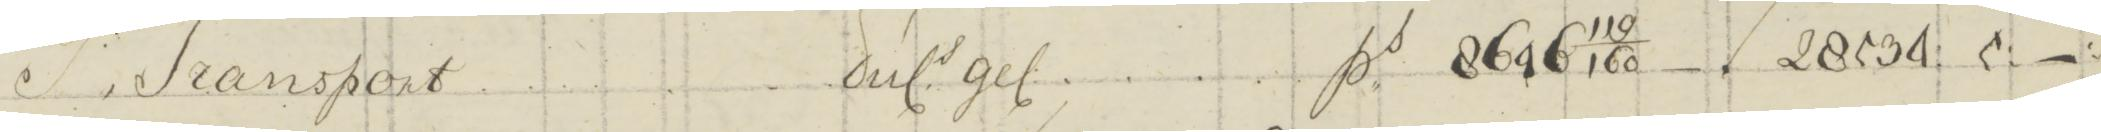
P,r Transport . . . . . . .duc.s gec:. . . . . p„s 8646 119/160 —ƒ 28534:5:—:
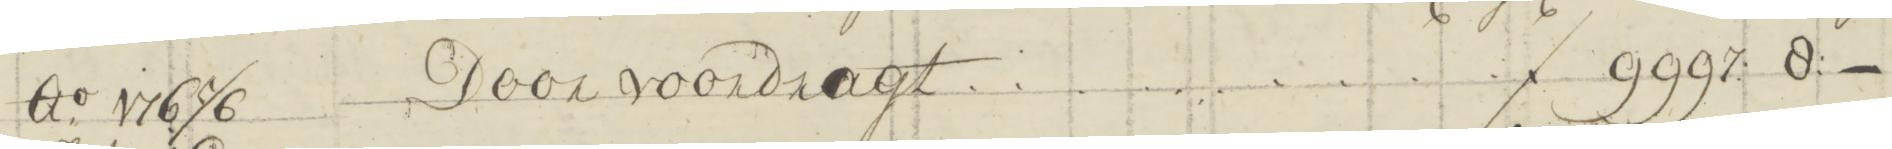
A„o 176 5/6 Door voordragt . . . . . . . . . .ƒ 9997:8:—
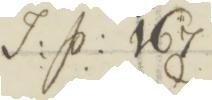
I: p: 167
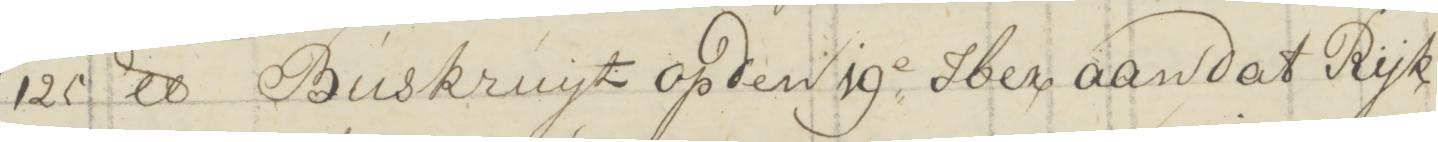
125 lb Buskruijt op den 19„e Iber aan dat Rijk
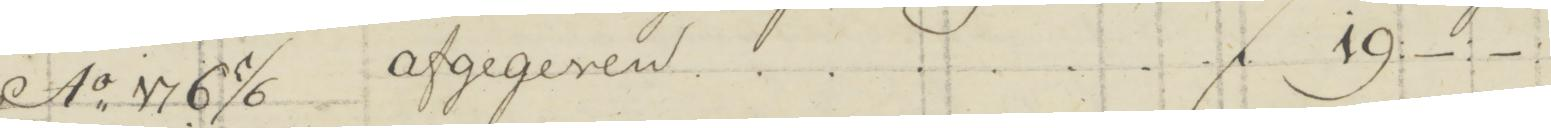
A„o 176 5/6 afgegeven . . . . . . . . ƒ 19:—:—:
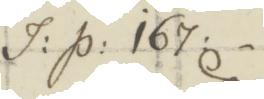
I: p: 167:-
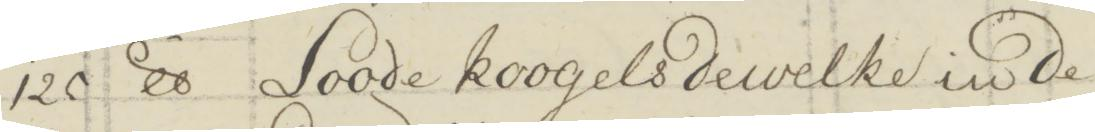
125 lb Loode koogels dewelke in de
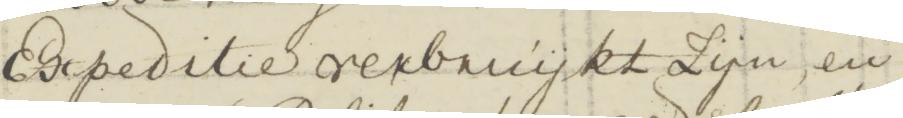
Expeditie verbruijkt zijn, en
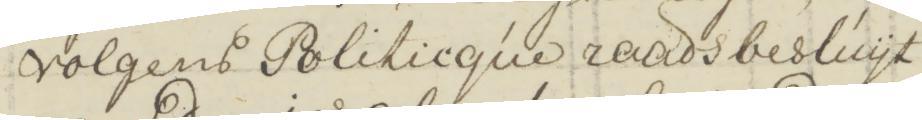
volgens Politicque raads besluijt
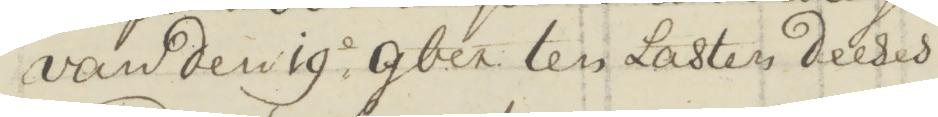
van den 19„e gber: ten lasten deezes
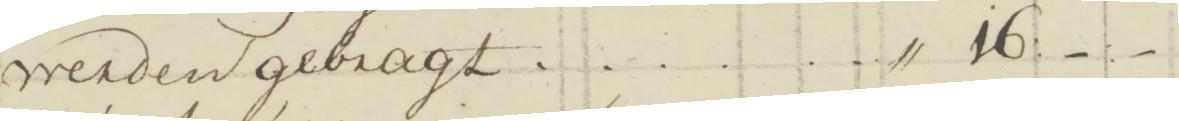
werden gebragt . . . . . . .„ 16:—:—
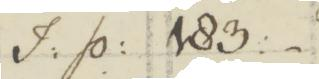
I: p: 183:-
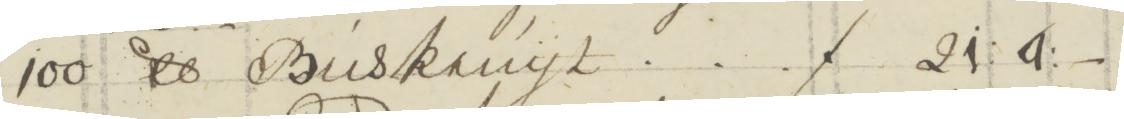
100 lb Buskruyt . . . ƒ 21:4:—
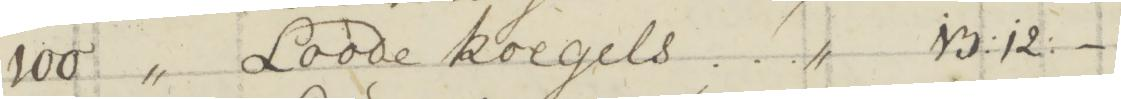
100 „ Loode koegels . . .„ 13:12:—
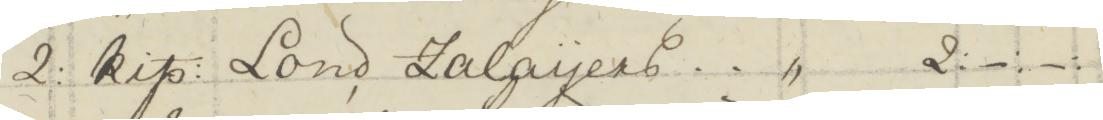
2:kip: Lond Zalaijers . . „ 2:—:—:
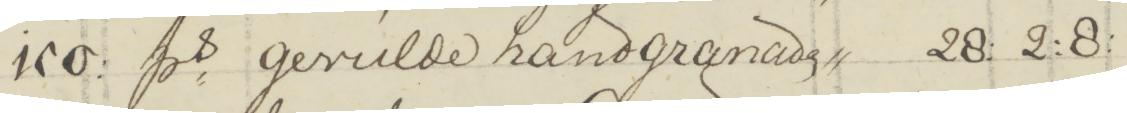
150 p„s gevulde handgranaden„ 28:2:8:
